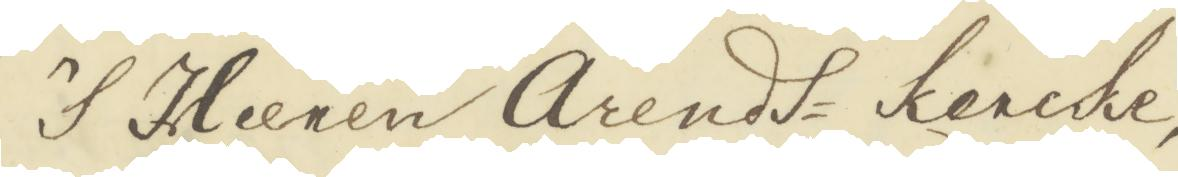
's Heeren Arends= kercke,
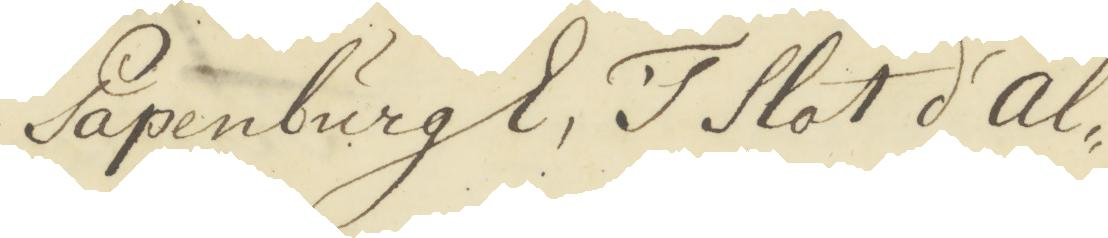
Papenburgh, T slot d’ Al„
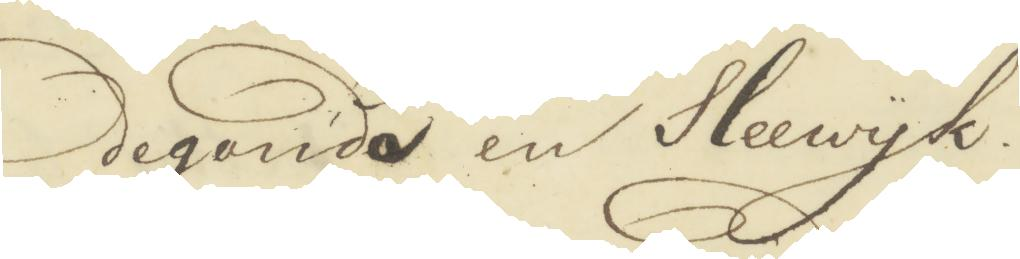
degonde en Sleewijk.
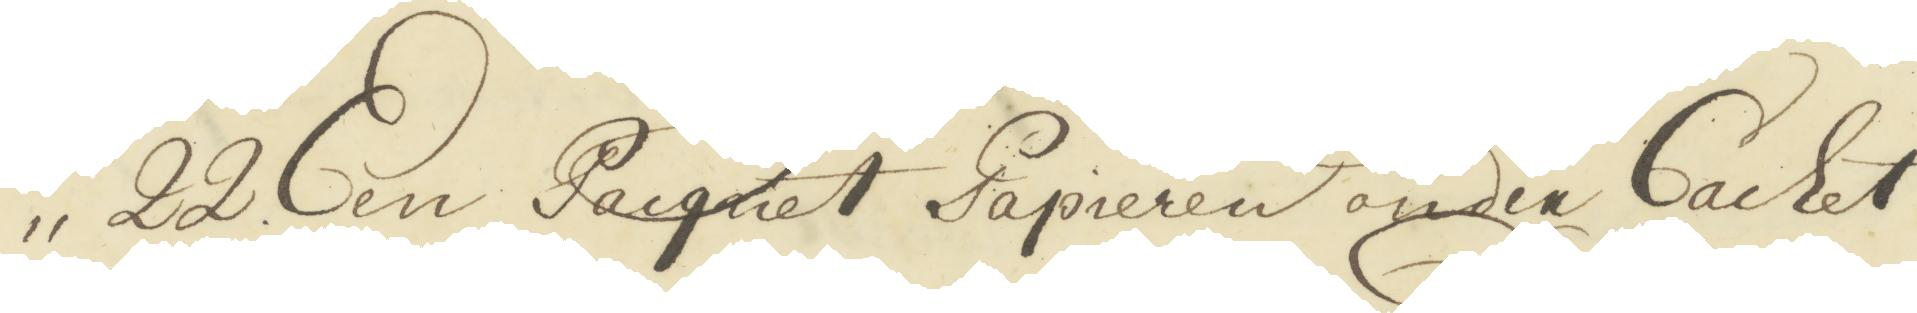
„ 22 Een Pacquet Papieren onder Cachet
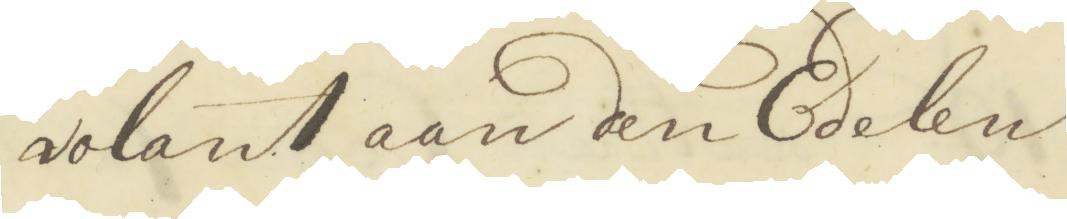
volant aan den Edelen
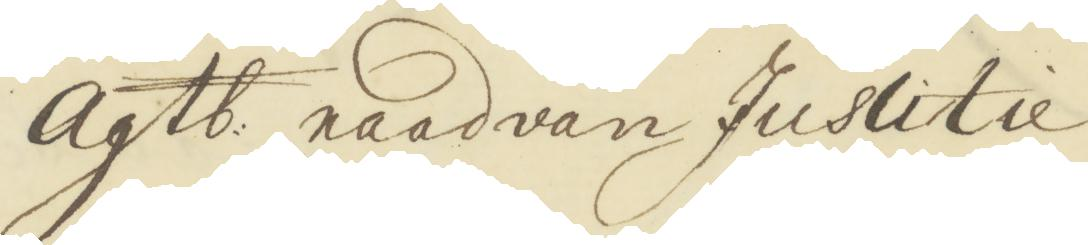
Agtb: raad van Justitie
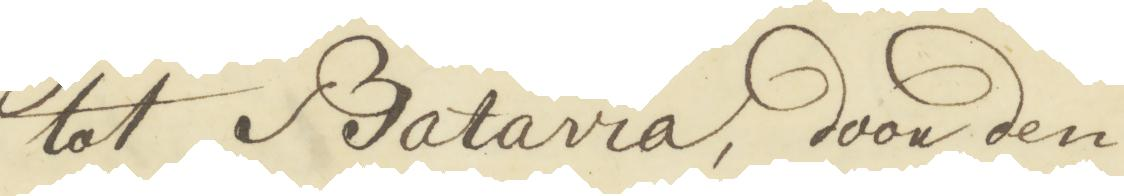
tot Batavia, door den
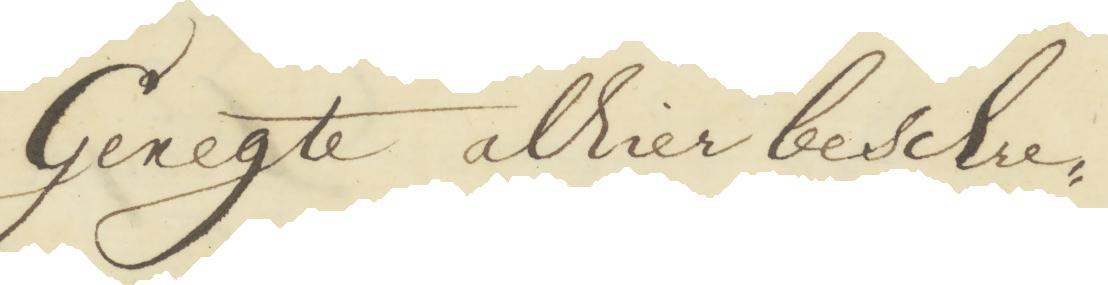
Geregte alhier beschre„
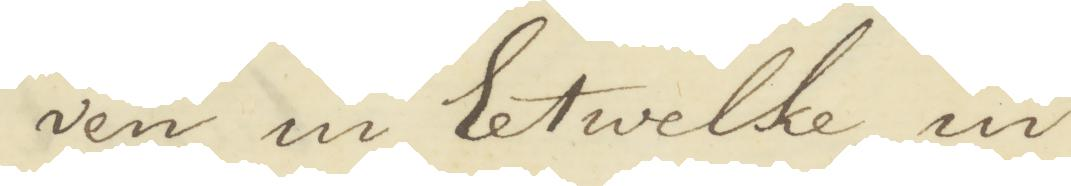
ven in hetwelke in
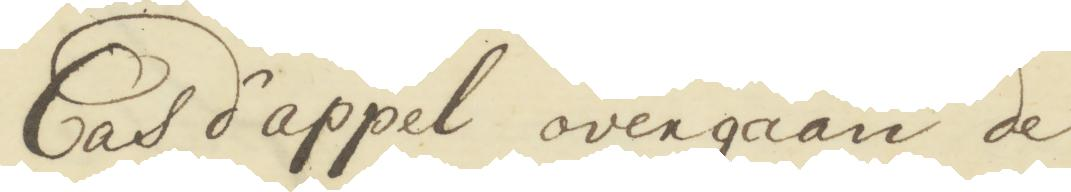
Cas d’appel overgaan de
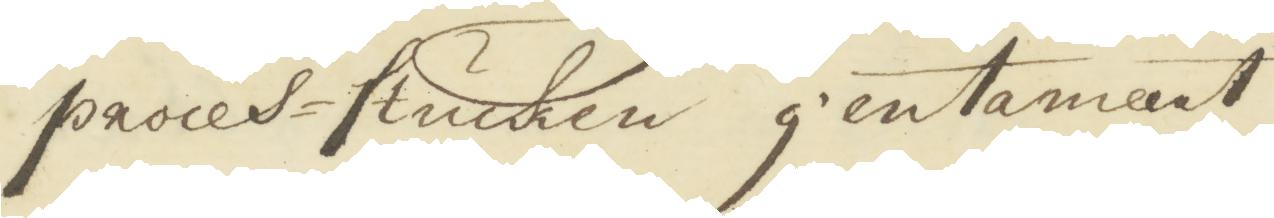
proces=stucken g’entameert
